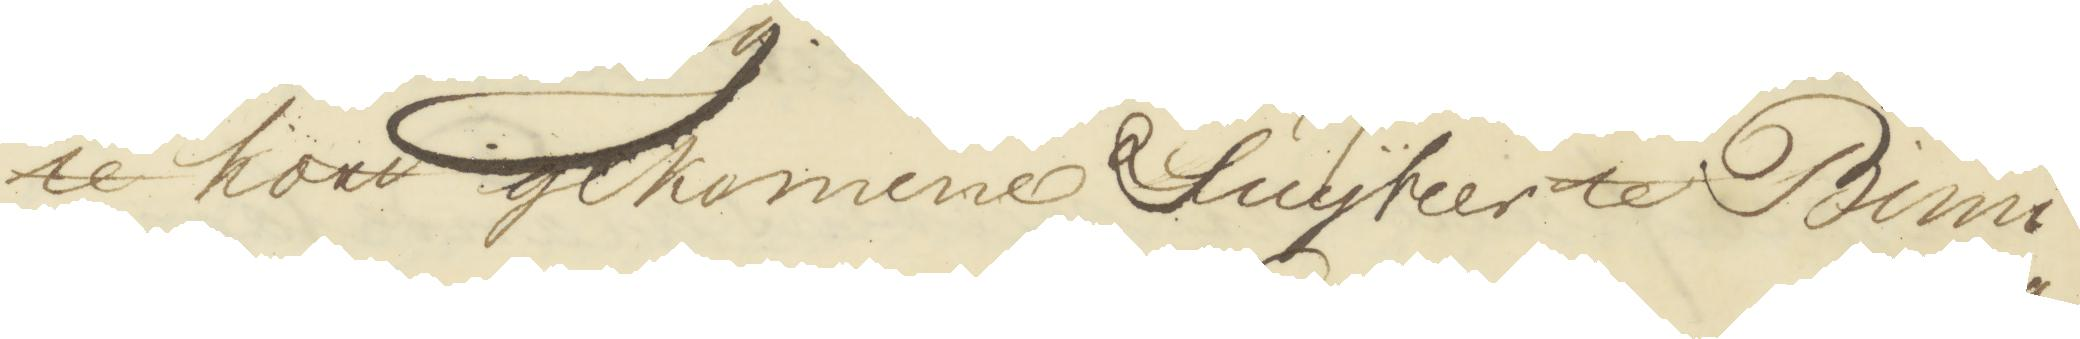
te kort gekomene suijker te Bimi„
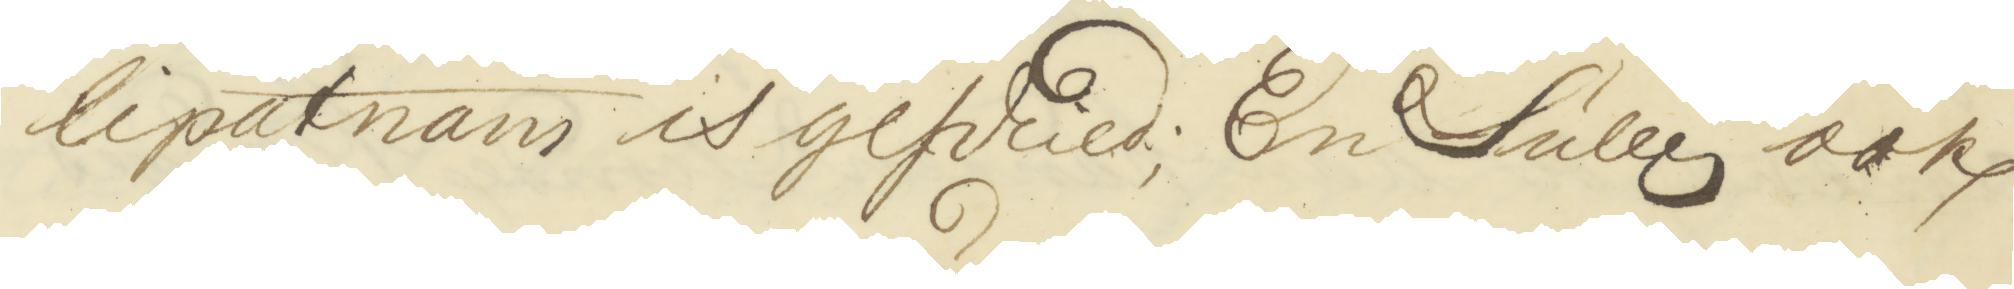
lipatnam is geschied; En sullen ook
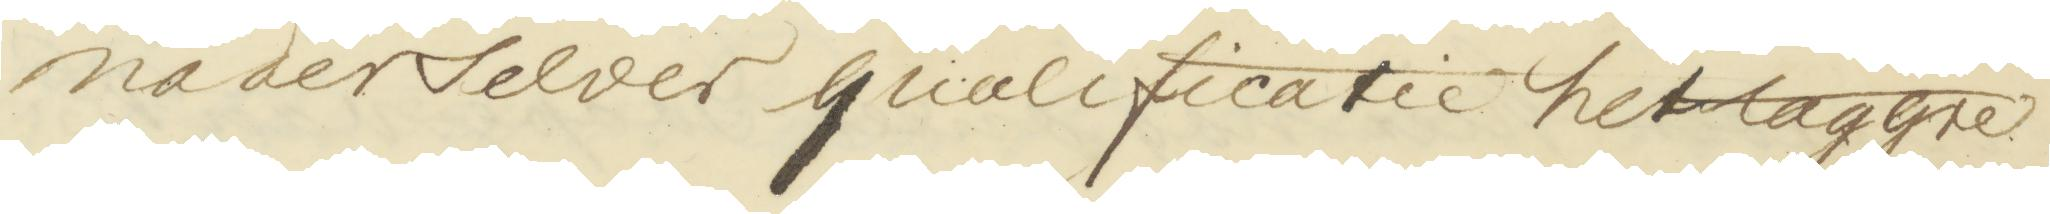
naderselver qualificatie hettaggte.
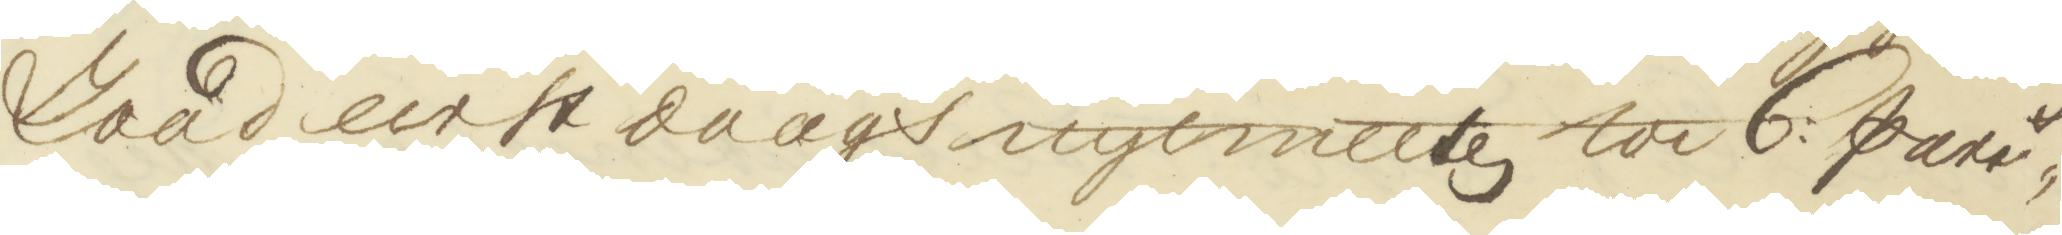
zaad eerst daags uijtmeeten tot 6: pari„s
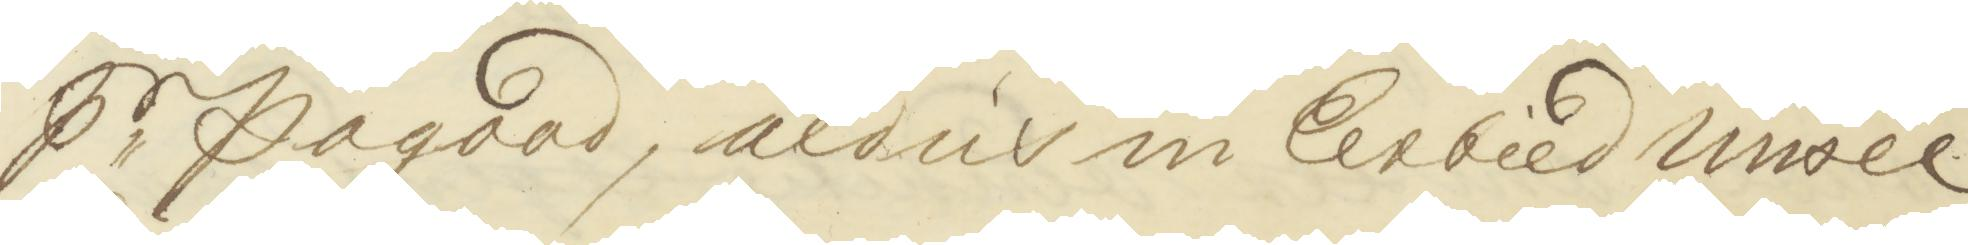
p„r Pagood, aldus in Eerbied uwel
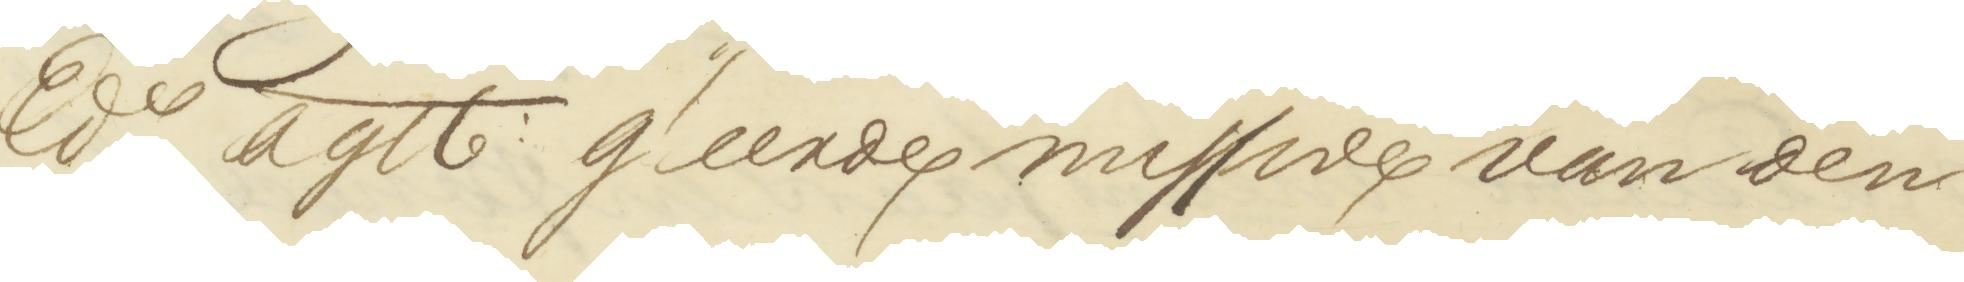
Ed„e agtb: g’eerde missive van den
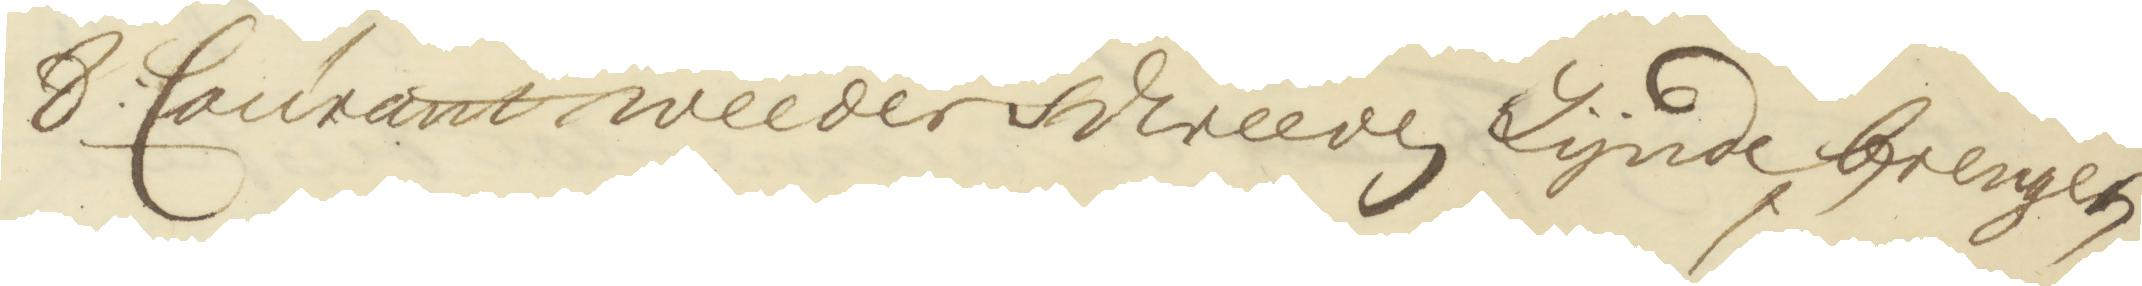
8: Courant weeder schreeden zijnde brengen
